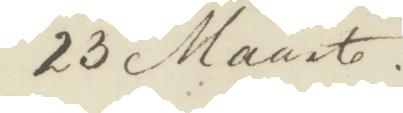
23 Maart
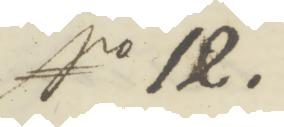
N=o 12.
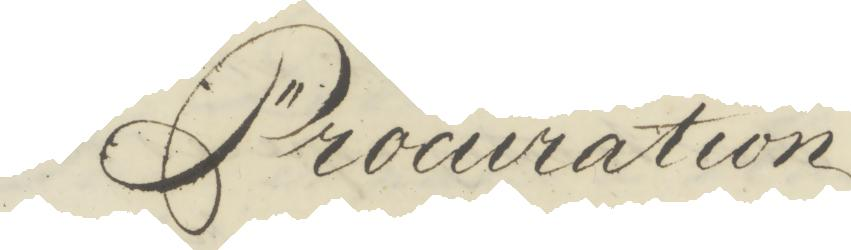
Procuration
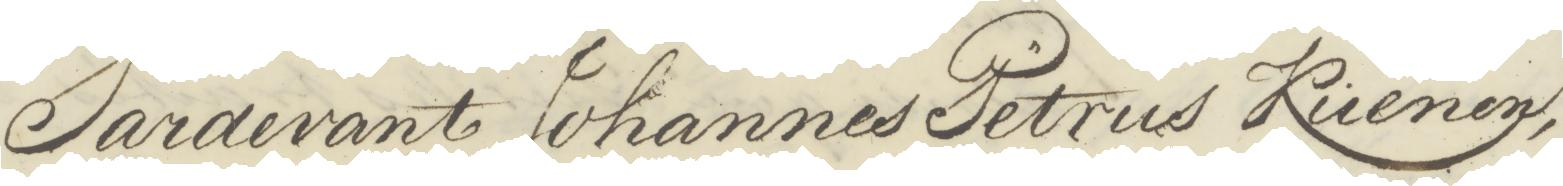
Pardevant Johannes Petrus Kuenen,
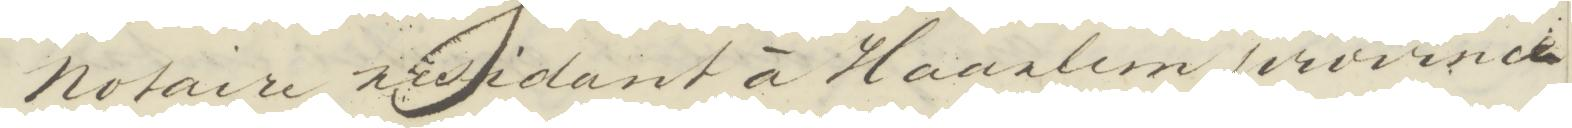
Notaire, residant a Haarlem, province
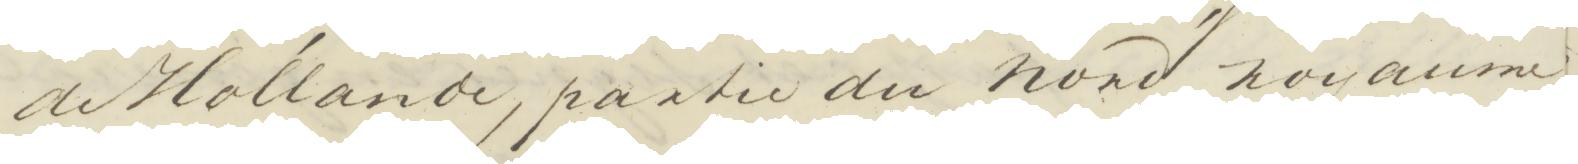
de Hollande, partie du Nord, royaume
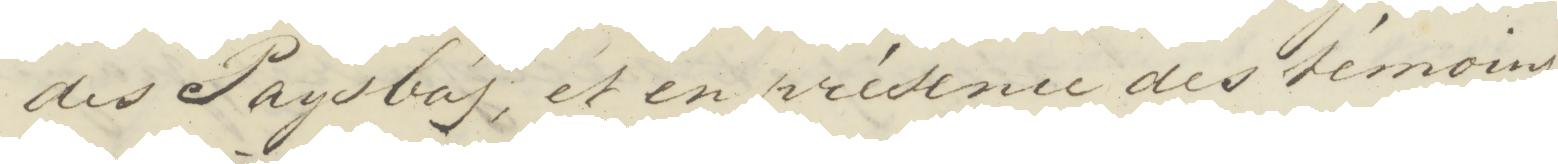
des Paysbas, et en présence des témoins
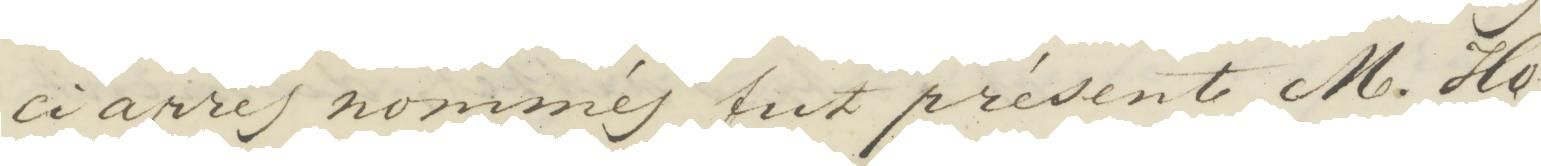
ci après nommés fut présente M. Ho,
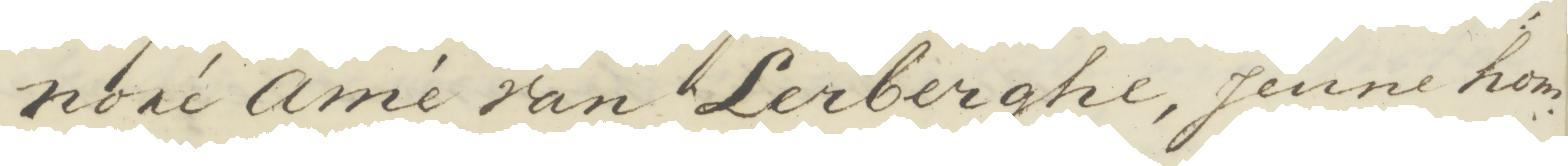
=noré Amé van Lerberghe, jeune hom„
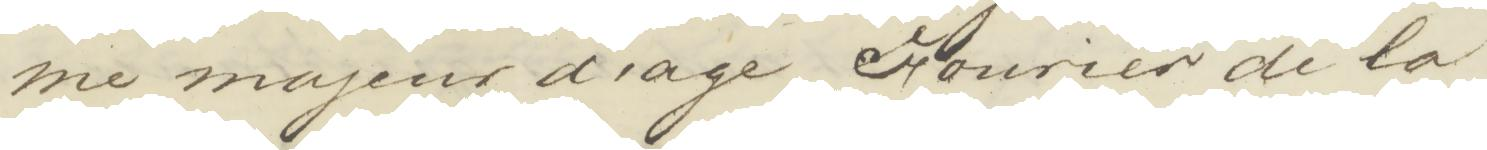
=me majeur d'age, Fourier de la
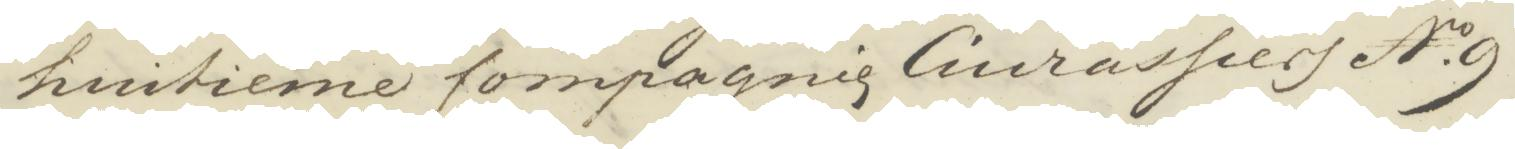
huitieme Compagnie Curassiers N=.o 9
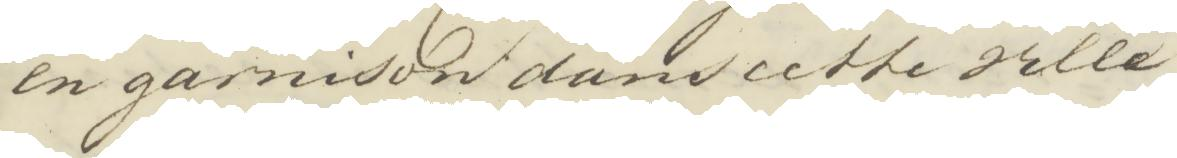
en garnison dans cette ville
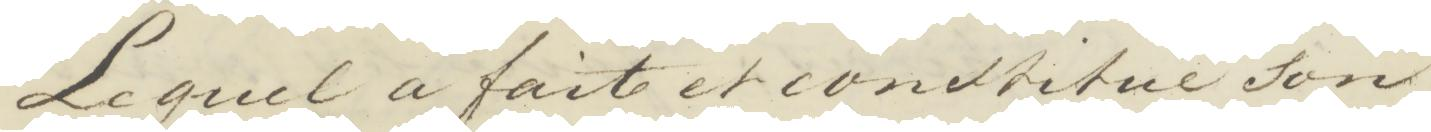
Le quel a fait et constitué son
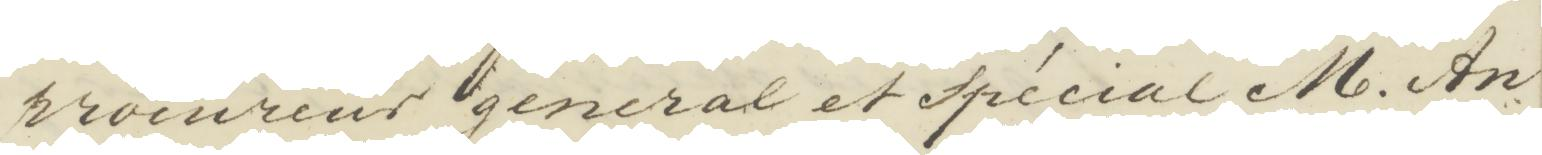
procureur general et spécial M. An„
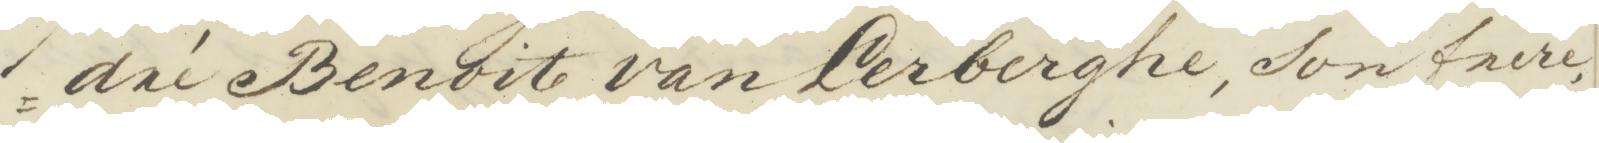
=dré Benoit van Lerberghe, son frère,
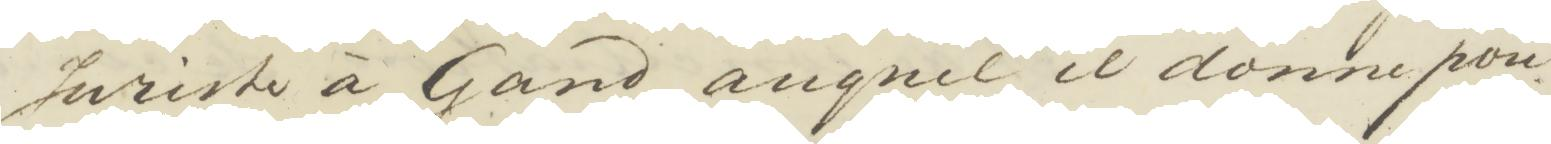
Juriste à Gand, auquel il donne pou„
